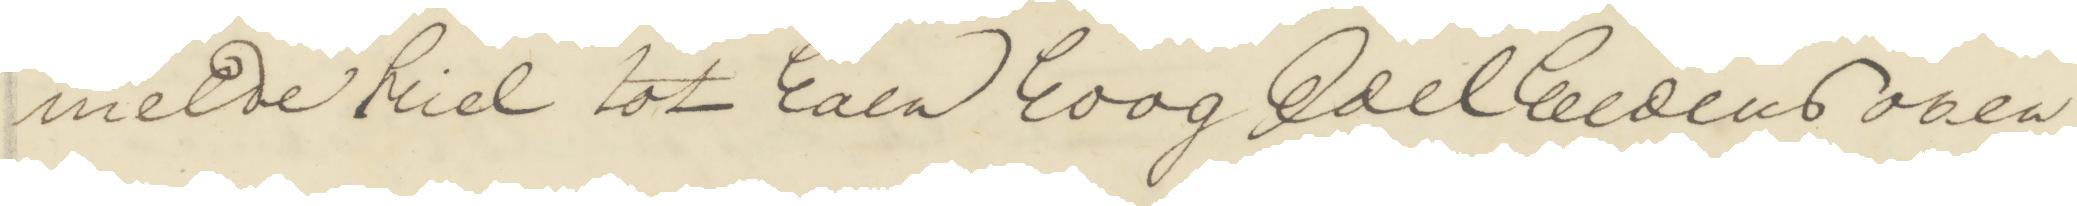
melde kiel tot haer hoog Edelheedens over
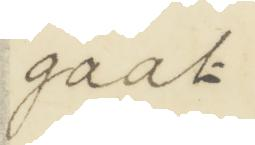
gaat
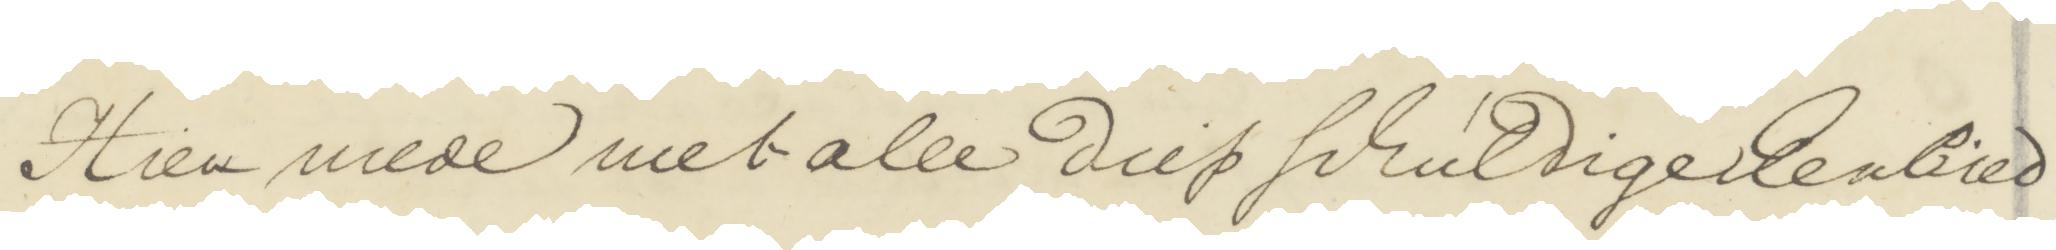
Hier mede met alle diep schuldige Eerbied
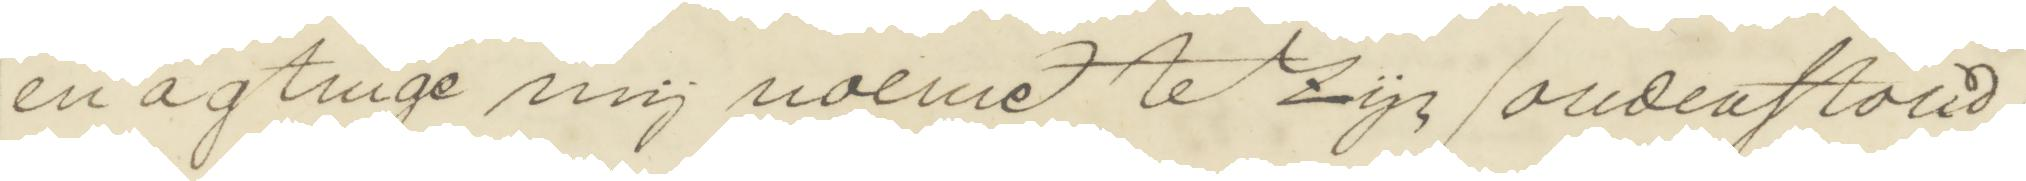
en agtinge mij noeme te zijn /onderstond/
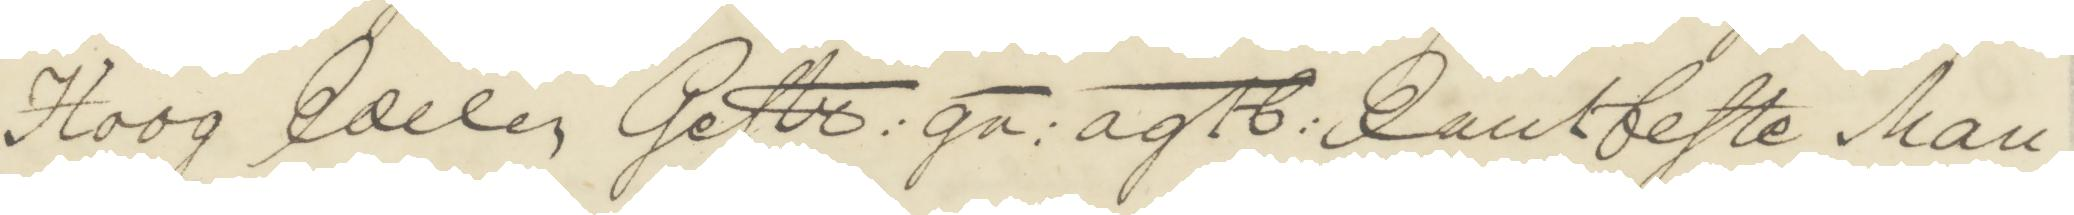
Hoog Edelen Gestr: gr: agtb: Erntfeste Man
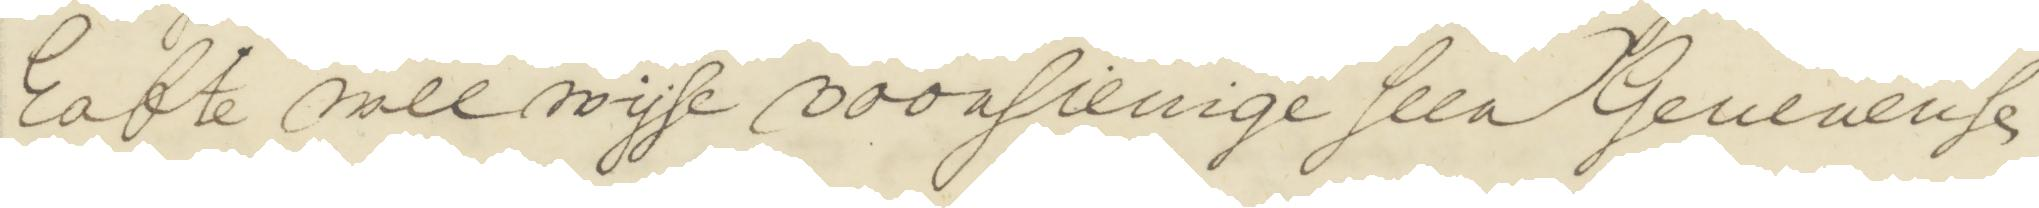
hafte wel wijse voorsienige seer Genereusen
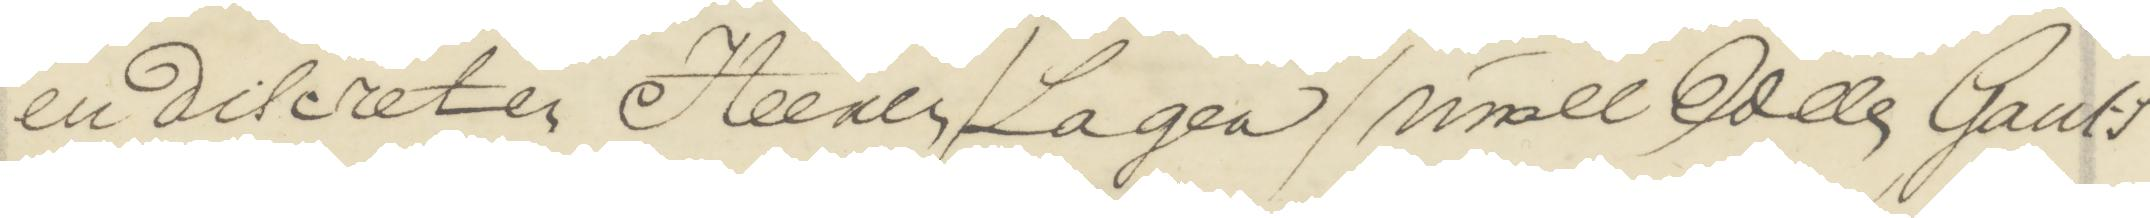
en discreten Heeren /Lager/ uwel Edelen Gants
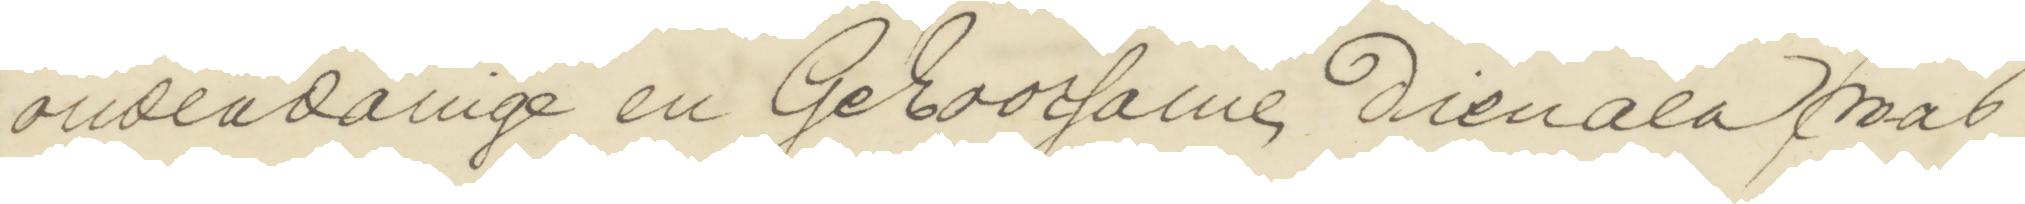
onderdanige en Gehoorsamen dienaer /was
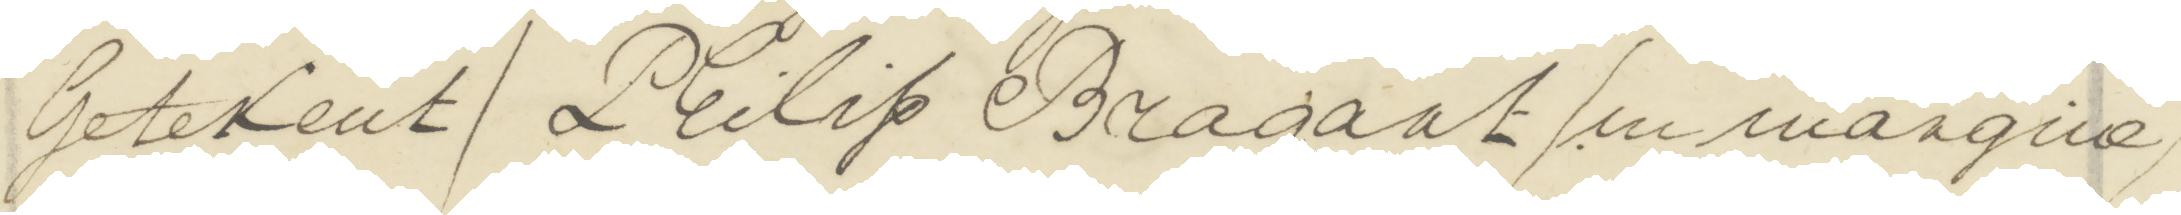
Getekent/ Philip Bragart /in margine/
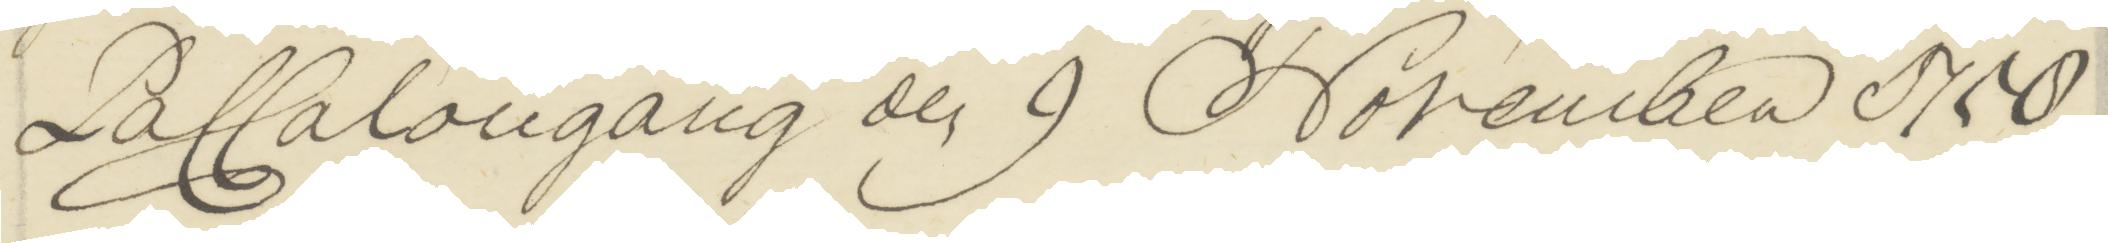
Paccalongang den 9 November 1758.
